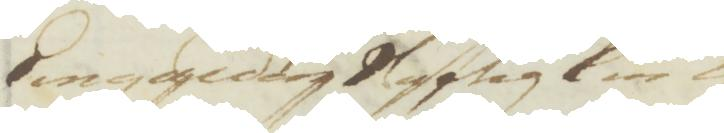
Een gulden Vijftig Cents
